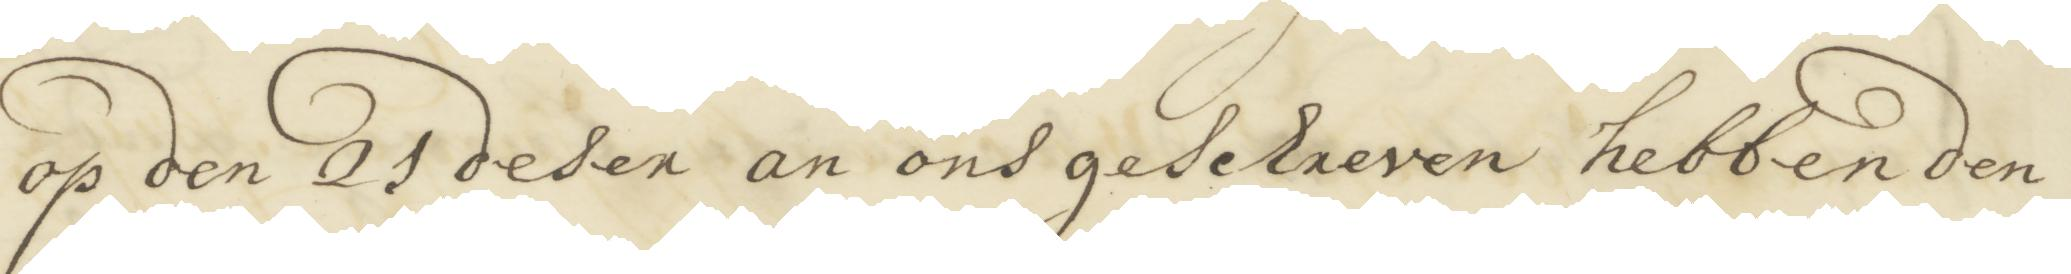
op den 21 deser an ons geschreven hebben den
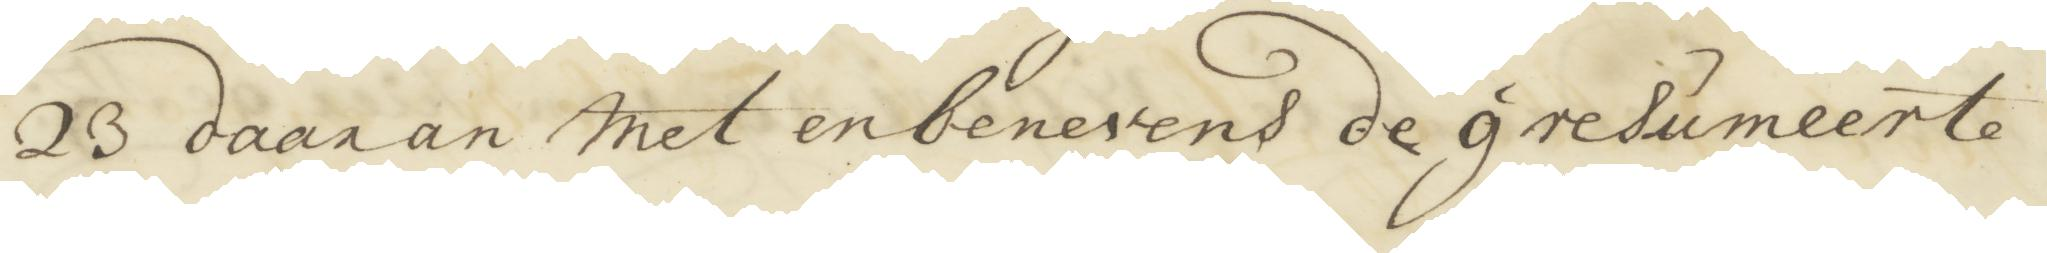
23 daaran met en benevens de g'resumeerte
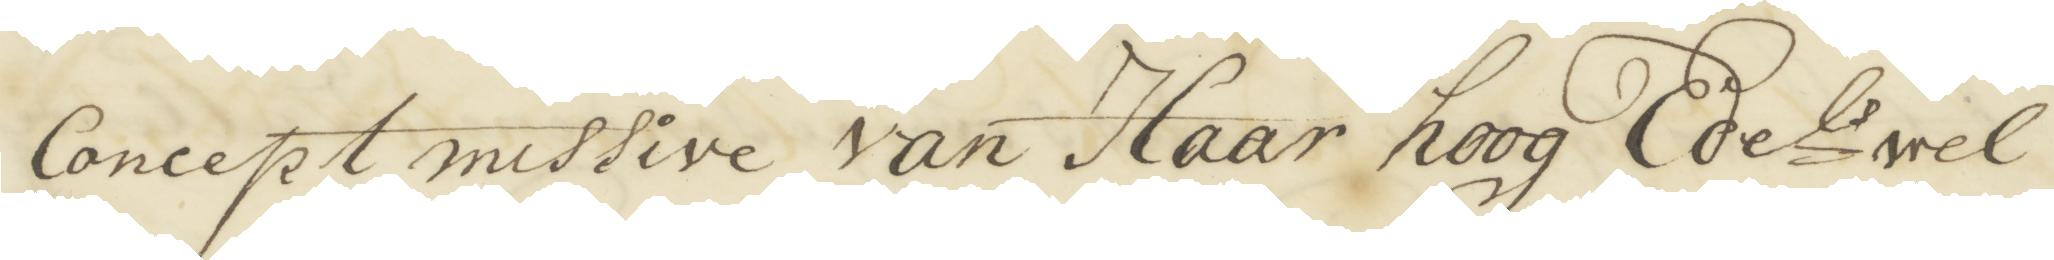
concept missive van Haar Hoog Edel=s wel
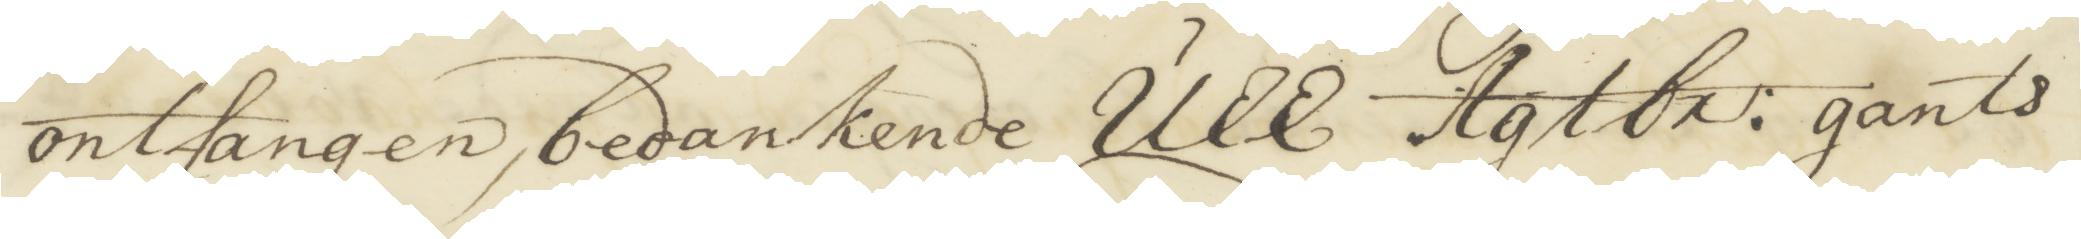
ontfangen, bedankende UEE Agtb: gants
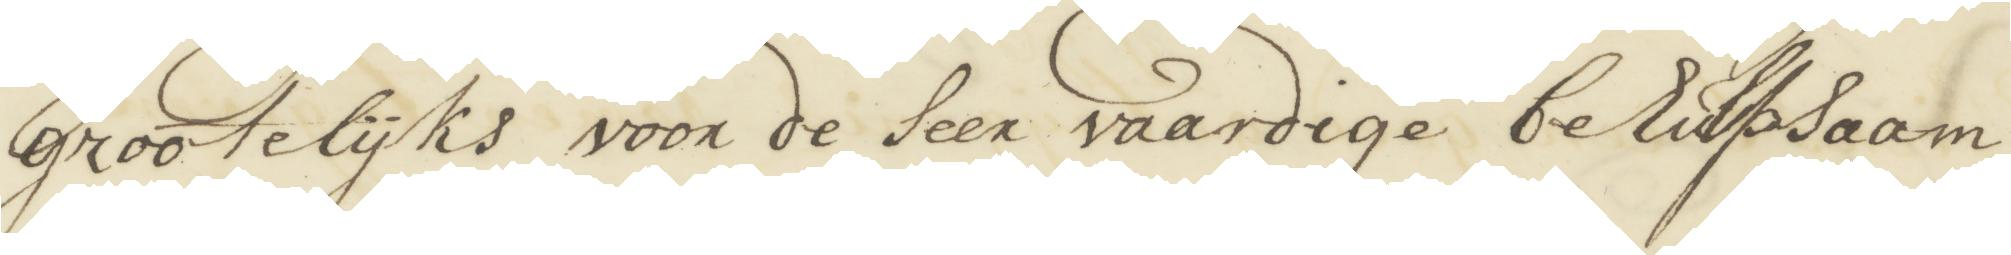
grootelijks voor de seer vaardige behulpsaam
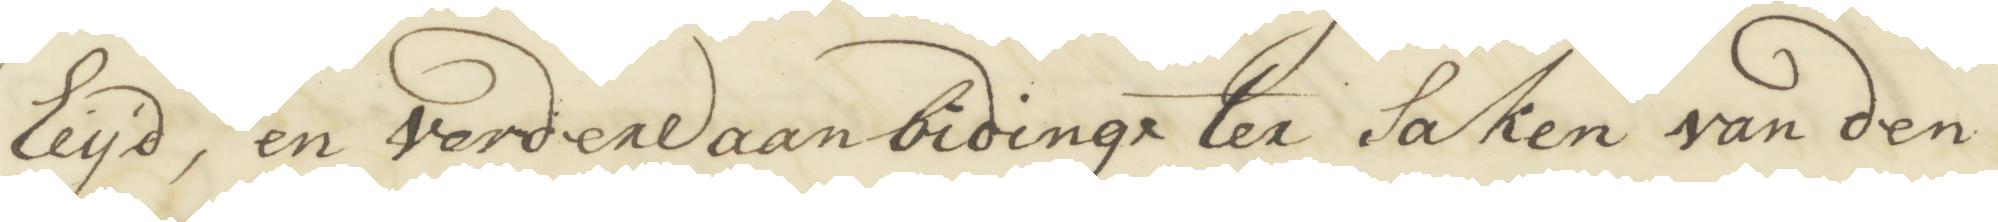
heijd en verdere aanbidinge ter saken van den
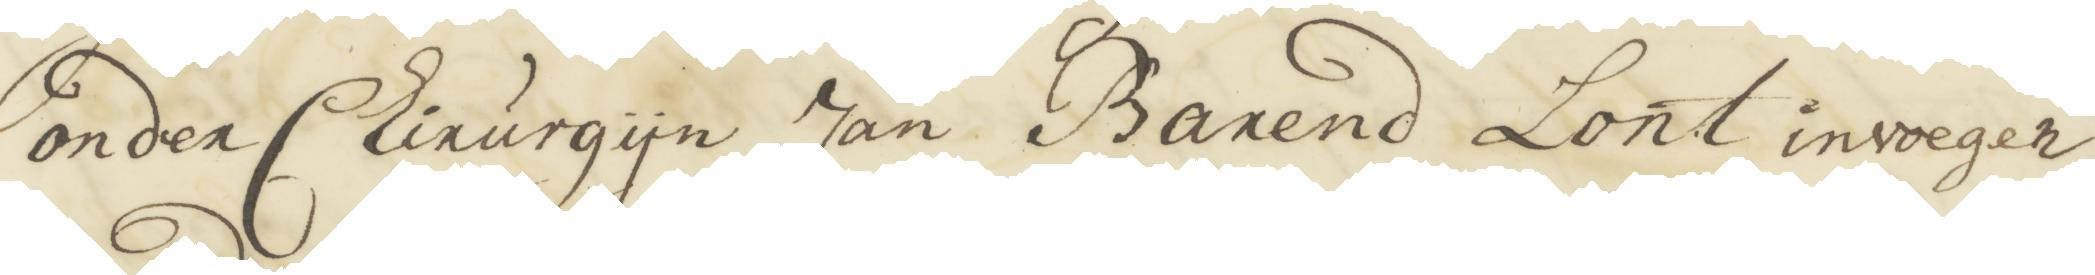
onder Chirurgijn Jan Barend Lont invoegen
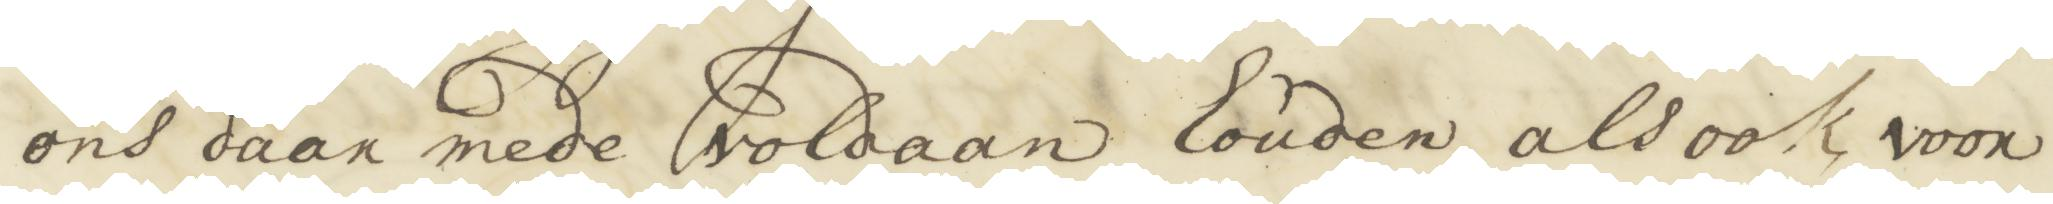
ons daar mede voldaan houden, als ook voor
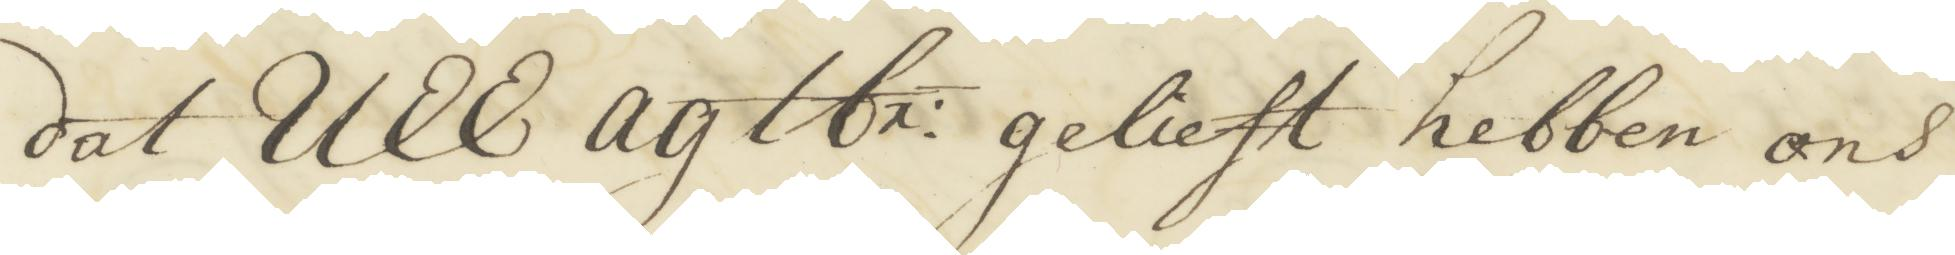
dat UEE Agtbr: gelieft hebben ons
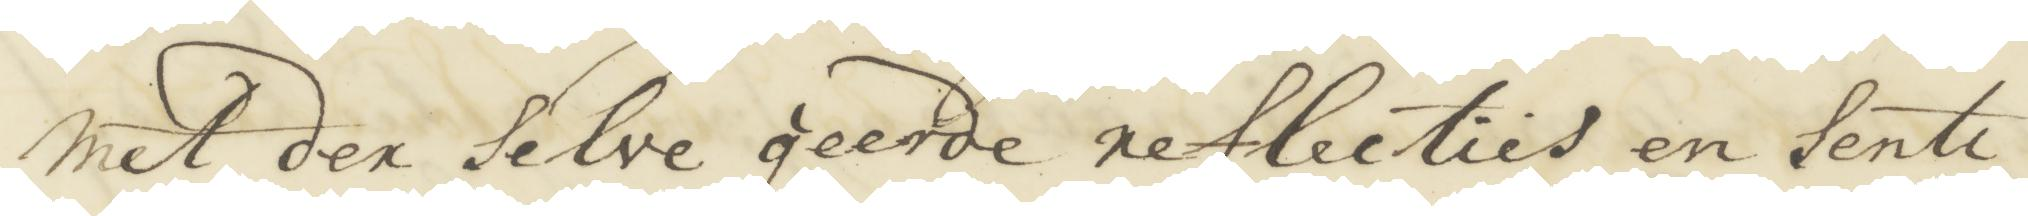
met der selve g'eerde reflecties en senti
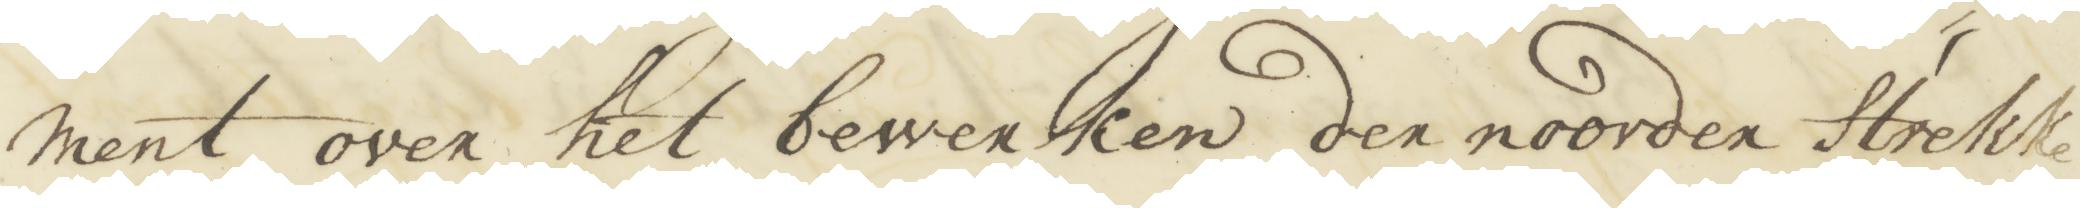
ment over het bewerken der noorder strekke
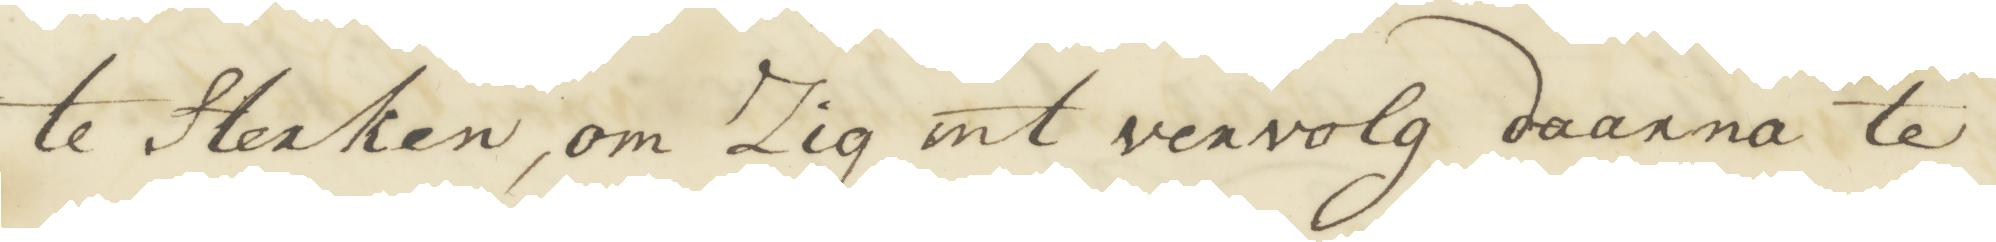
te sterken, om zig int vervolg daarna te
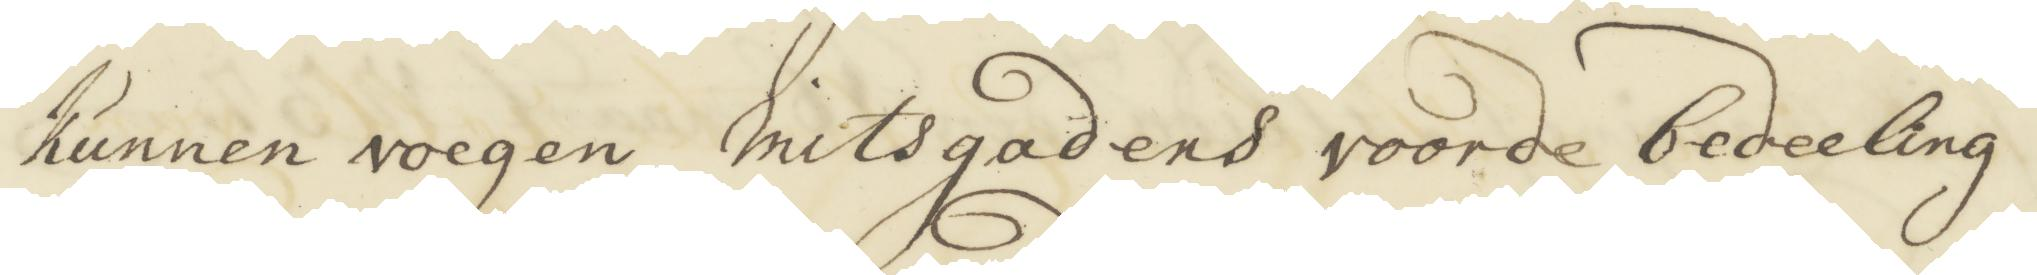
kunnen voegen, mitsgaders voorde bedeeling
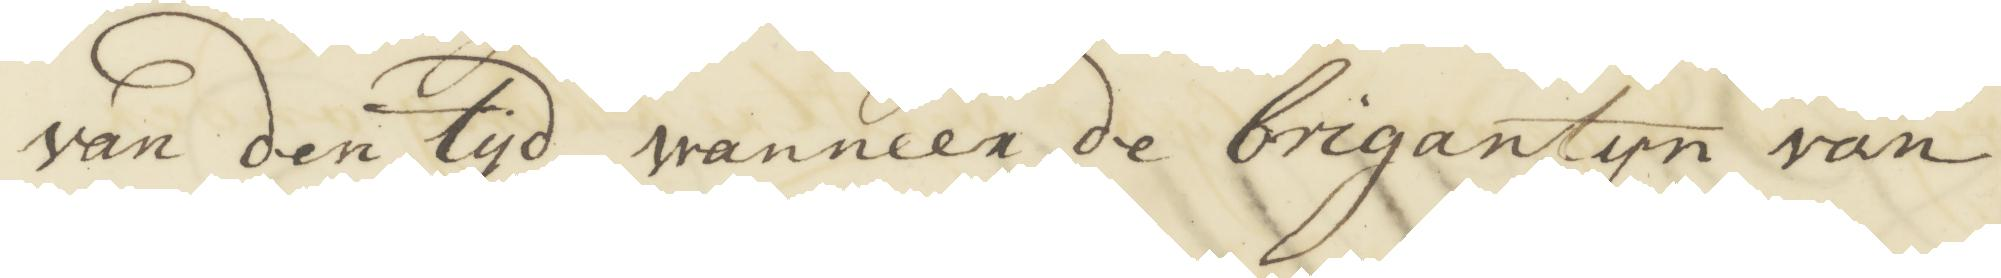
van den tijd wanneer de brigantyn van
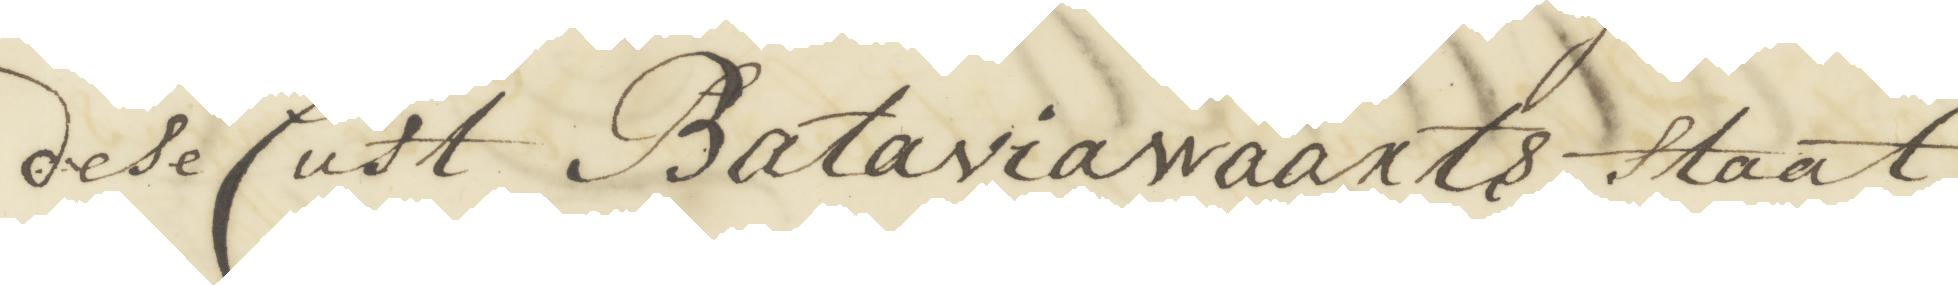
dese Cust Bataviawaarts staat
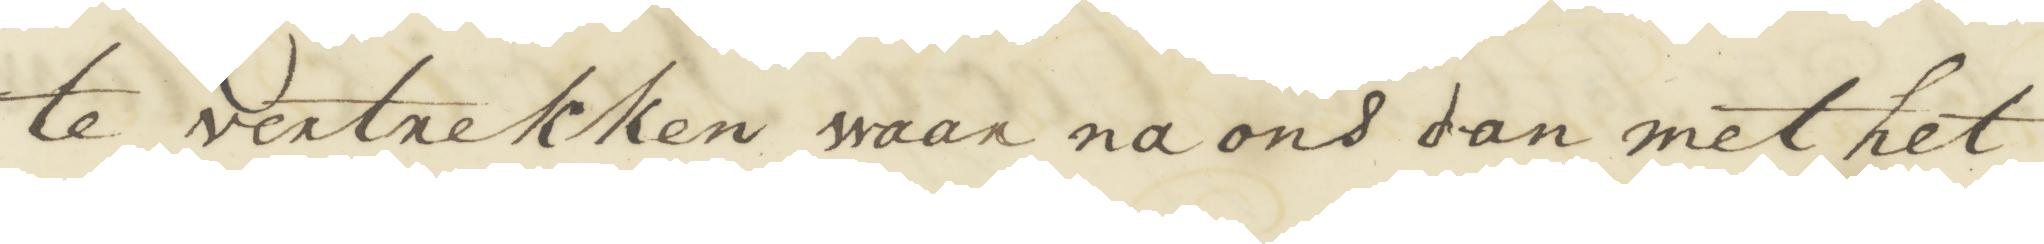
te vertrekken waar na ons dan met het
